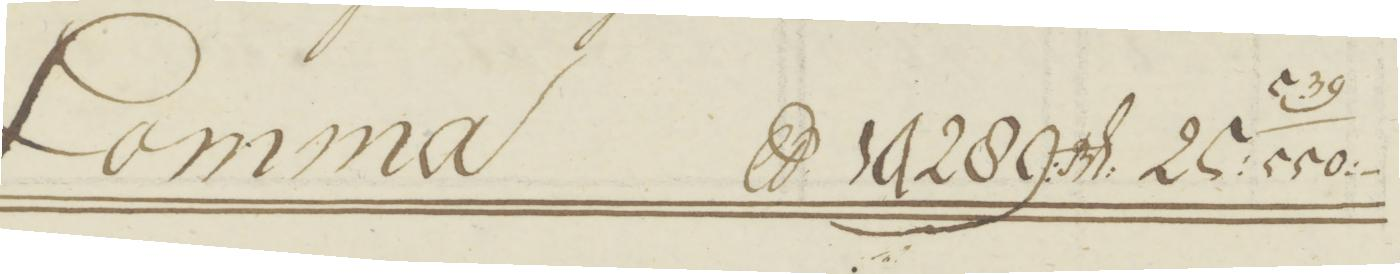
Somma lb. 14289.Bh: 25:5.39/550:-
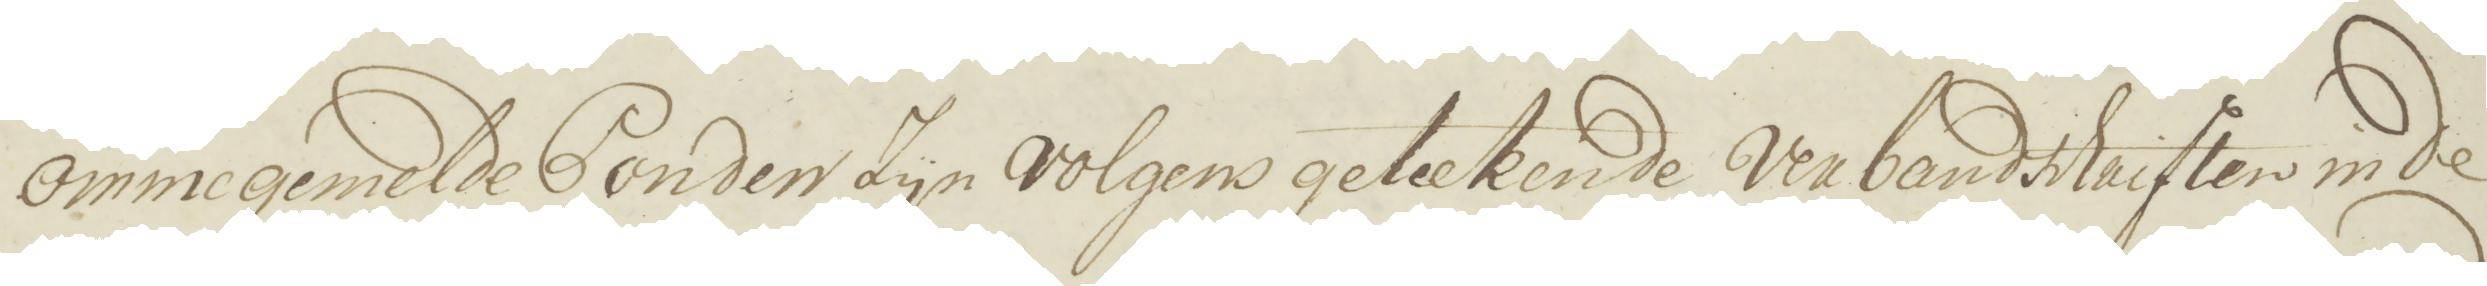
omme gemelde Ponden zijn volgens geteekende verbandschriften in de
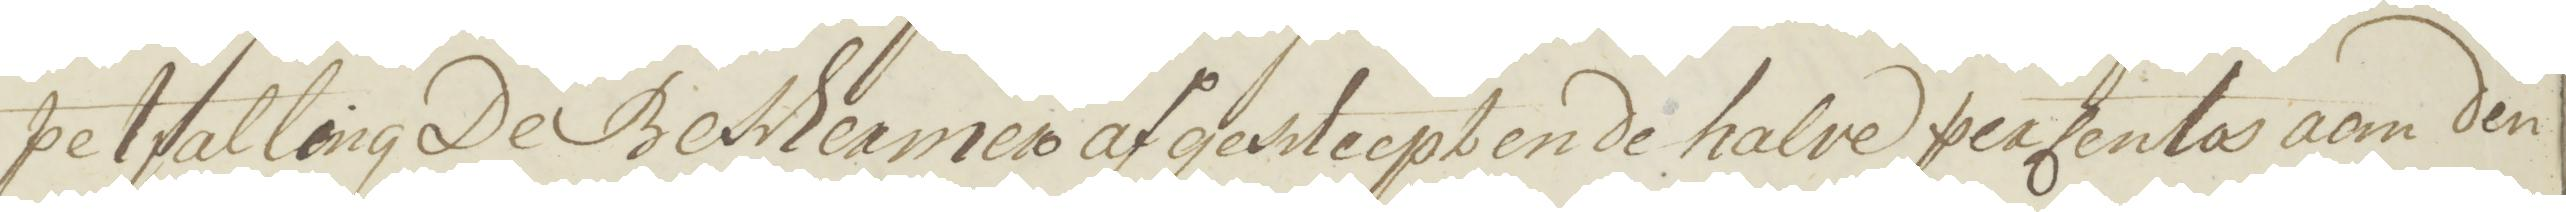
petjalling De Beschermer af gescheept ende halve percentos aan den
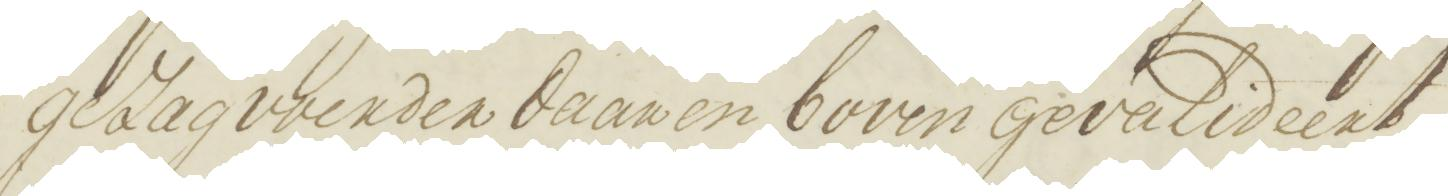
gezagvoerder daar en boven gevalideert
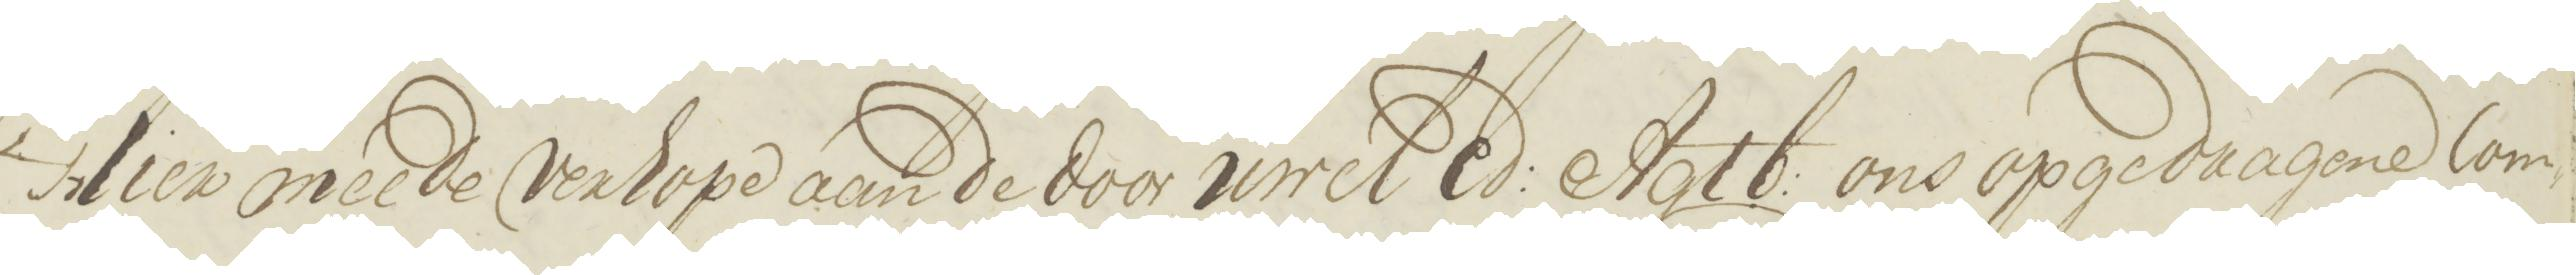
Hier meede verhope aan de door uwel Ed: Agtb: ons opgedragene Com
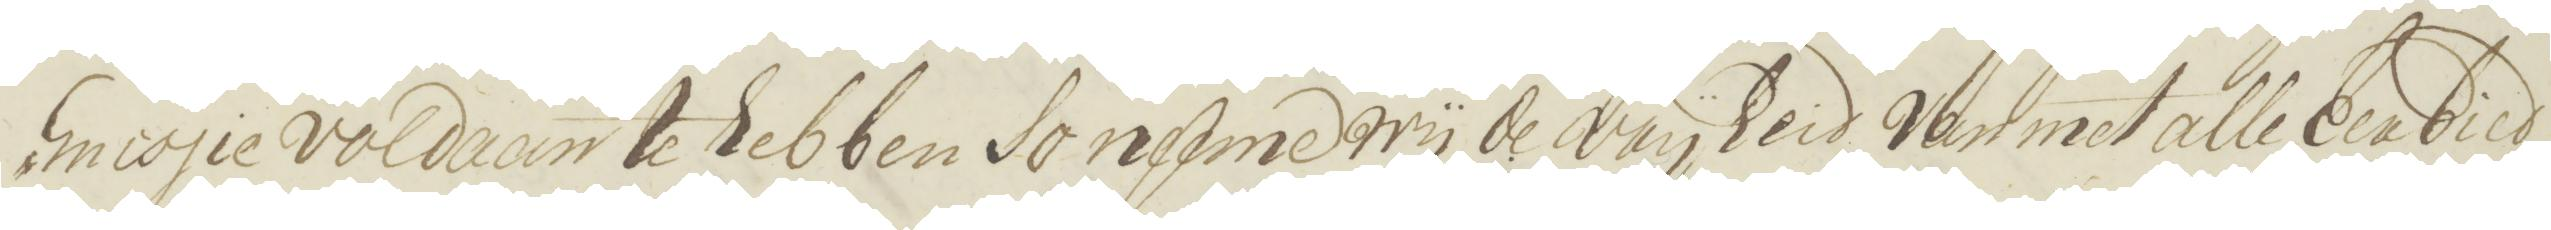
„missie voldaan te hebben so neeme wij de vrijheid van met alle Eerbied
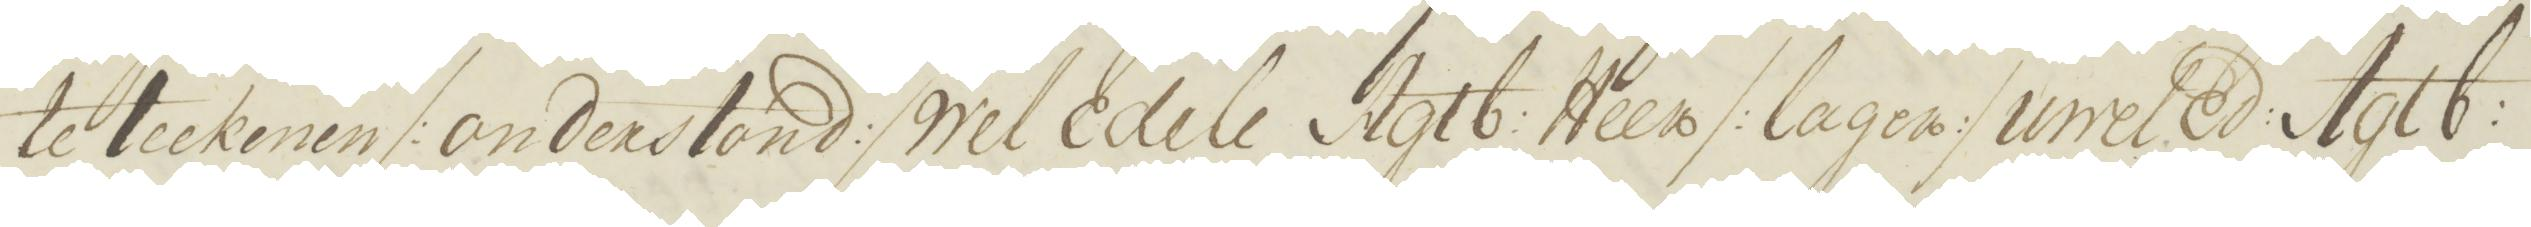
te teekenen /:onderstond:/ wel Edele Agtb: Heer /:lager:/ uwel Ed: Agtb:
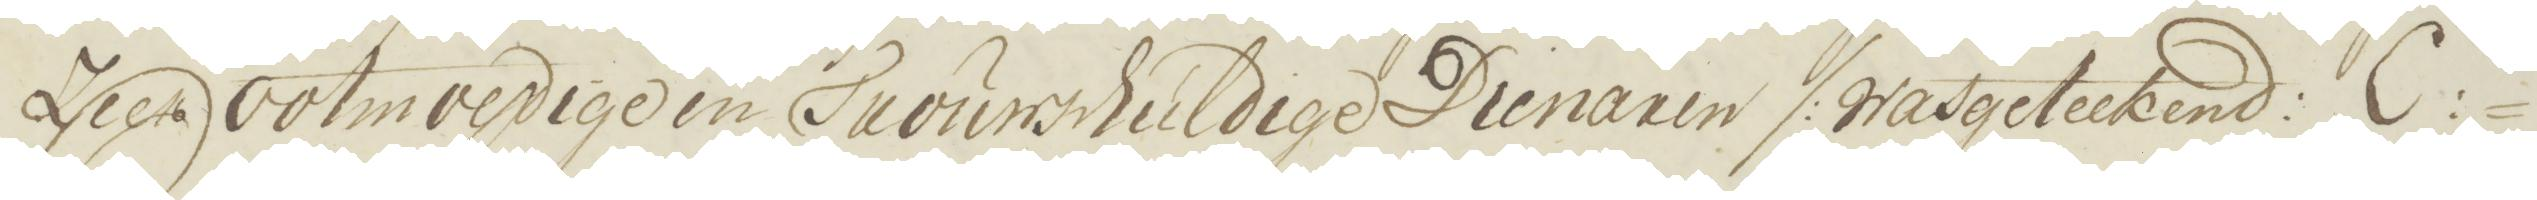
Zeer ootmoedige en Trouwschuldige Dienaren /:was geteekend: C:=s
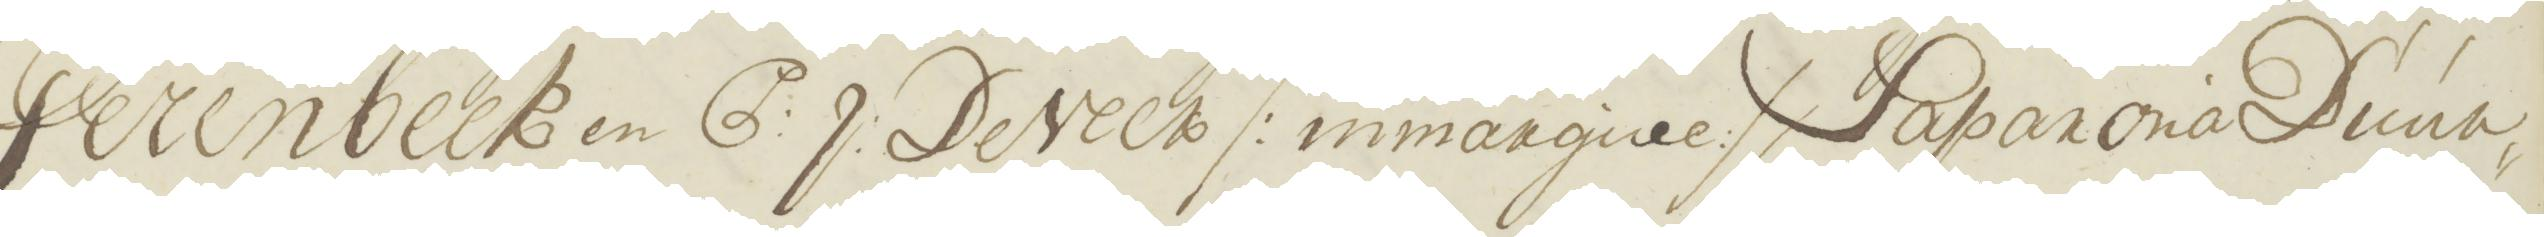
Gerenbeek en P: J: Deveck /:inmarginee:/ Saparoua Duur„
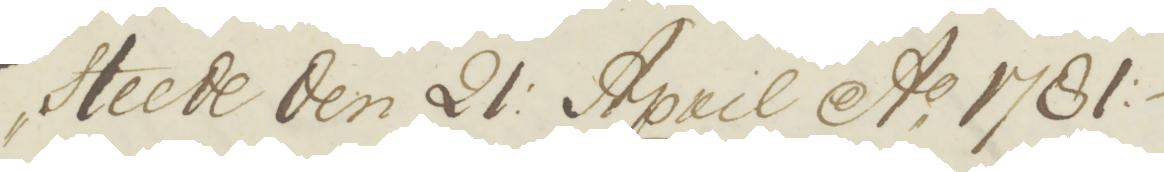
„steede den 21: April A„o 1781:
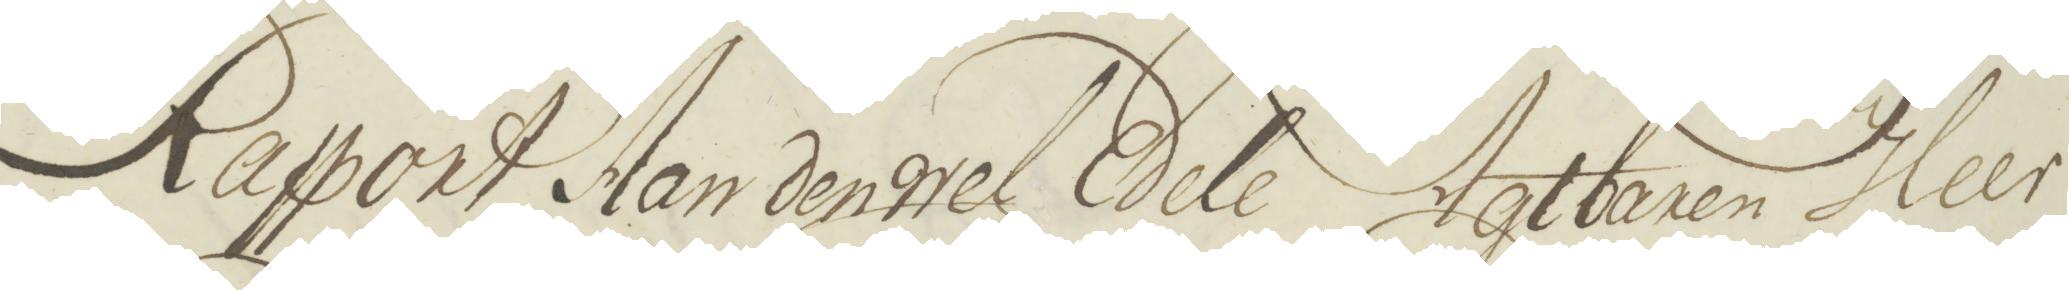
Raport Aan den wel Edele Agtbaren Heer
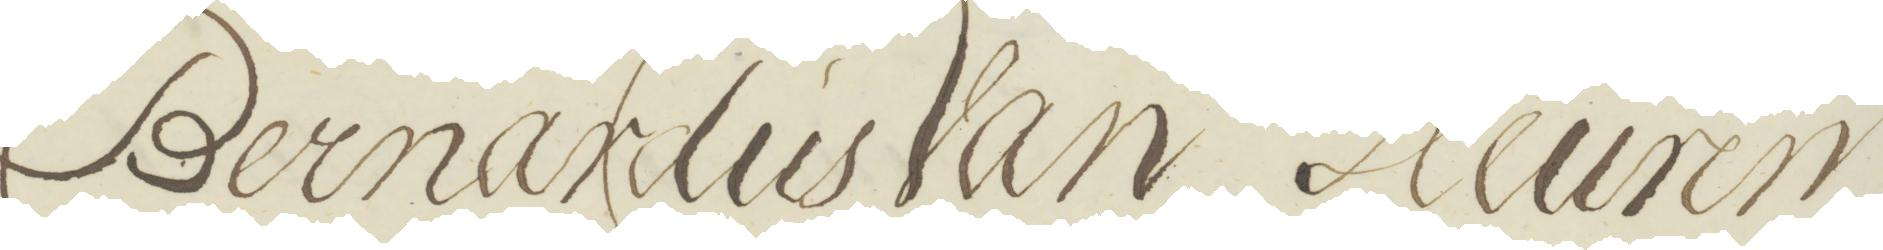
Bernardus Van Pleuren
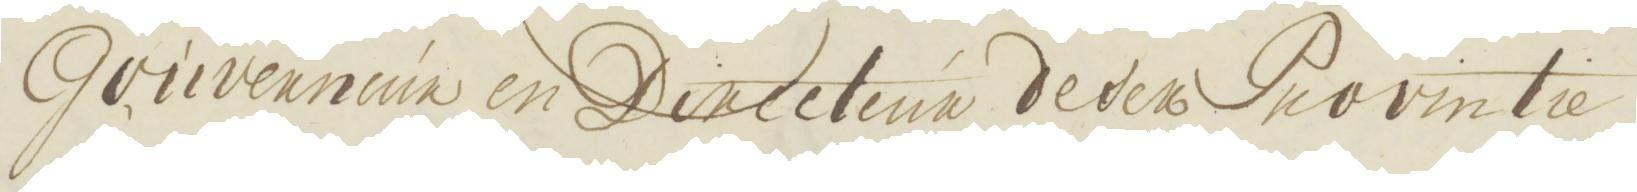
Gouverneur en Directeur deser Provintie
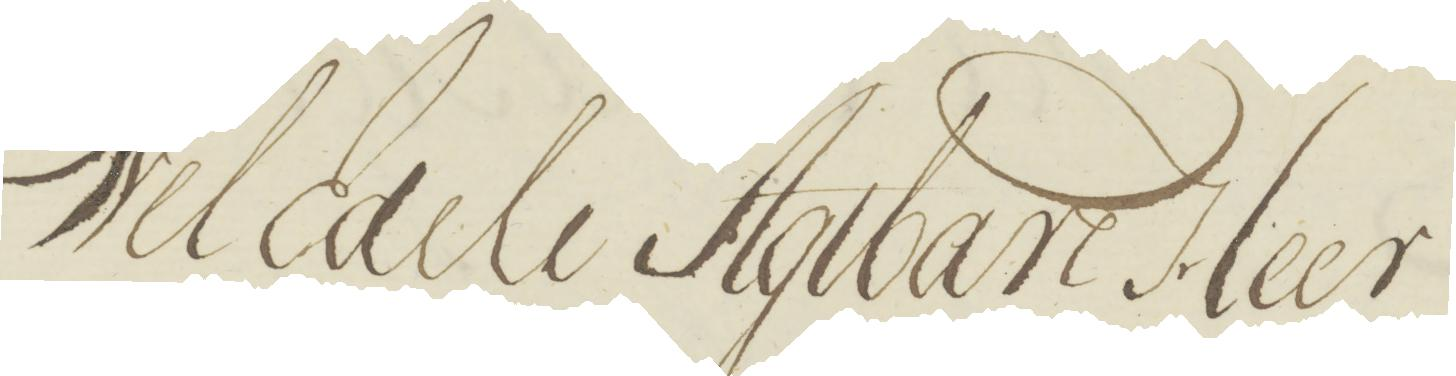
Wel Edele Agtbare Heer
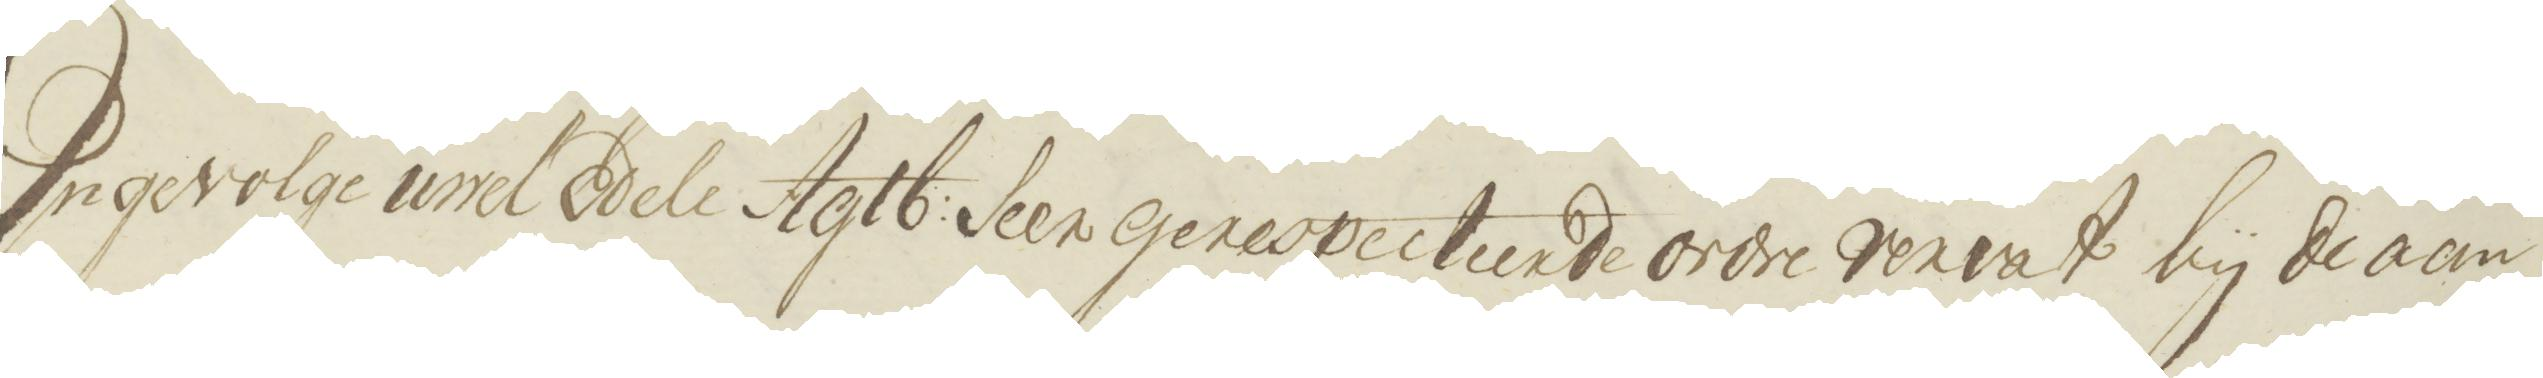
Jngevolge uwel Edele Agtb: seer gerespecteerde ordre vervat bij de aan
